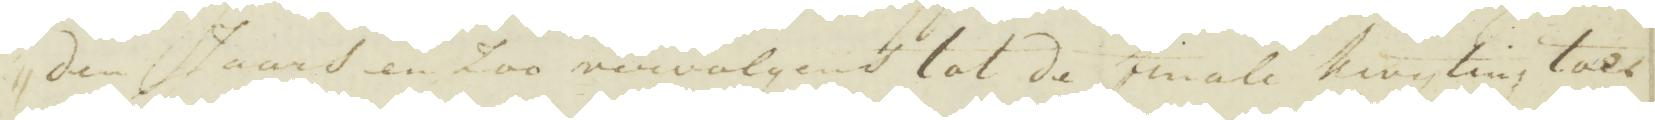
„den Jaars en zoo vervolgens tot de finale kwijting toe.
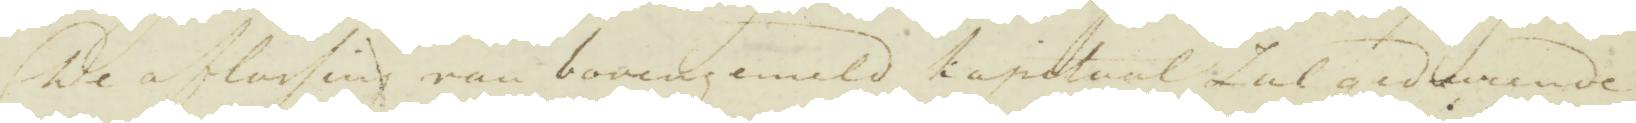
De aflossing van bovengemeld kapitaal zal gedurende
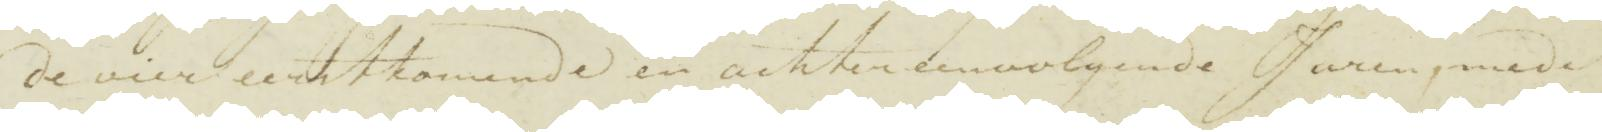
de vier eerstkomende en achtereenvolgende Jaren mede
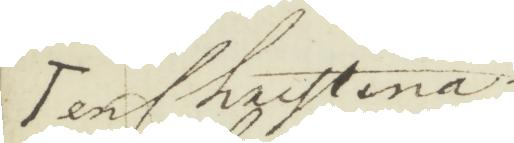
Ten Christina.
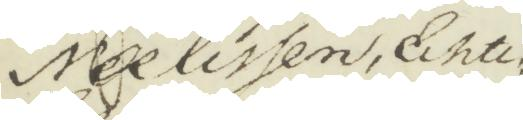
Neelissen, Echte
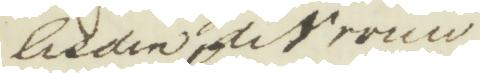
lieden,de Vrouw
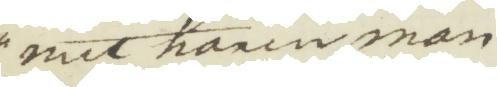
met haren man
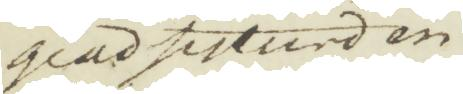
geadsisteerd en
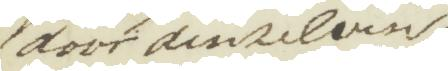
door denzelven
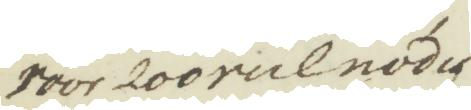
voor zoo veel nodig
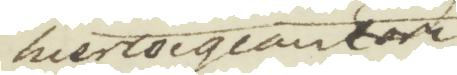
hiertoe geautori
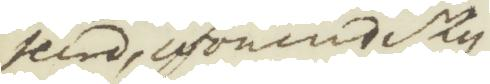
teerd, wonende zy
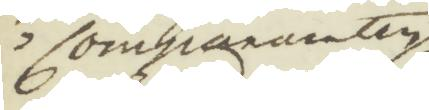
Comparanten
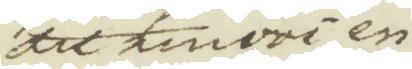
dit renvooi en
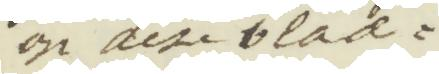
op deze blad=
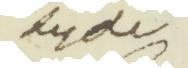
zyde
